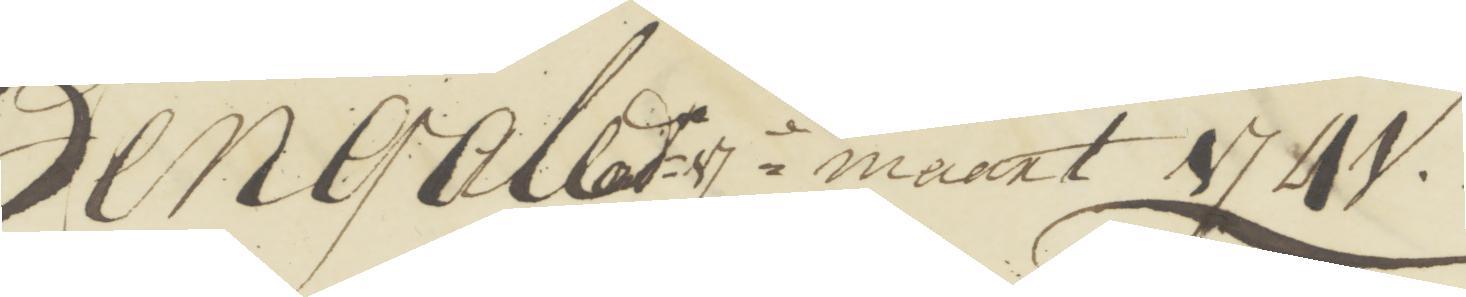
Van Bengale d=o 17=e maart 1741.
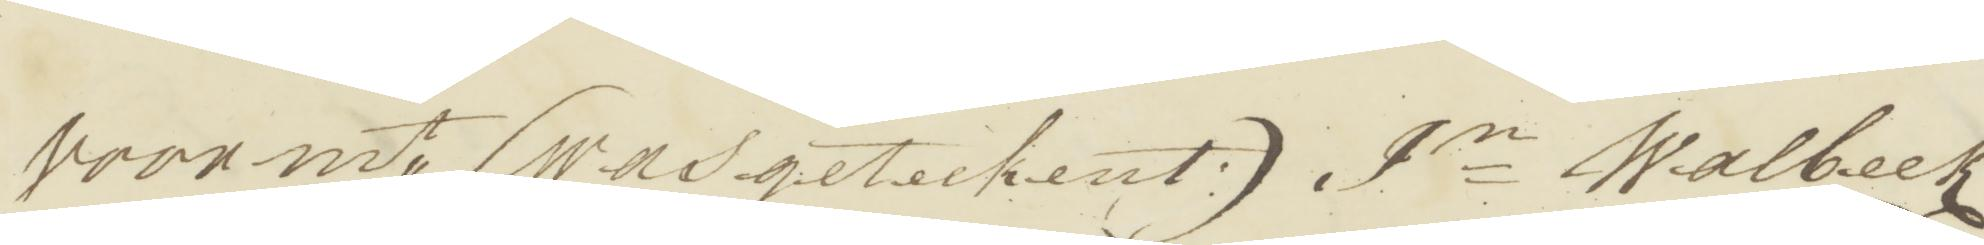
voor m„t (was geteekent:) I=n Walbeek
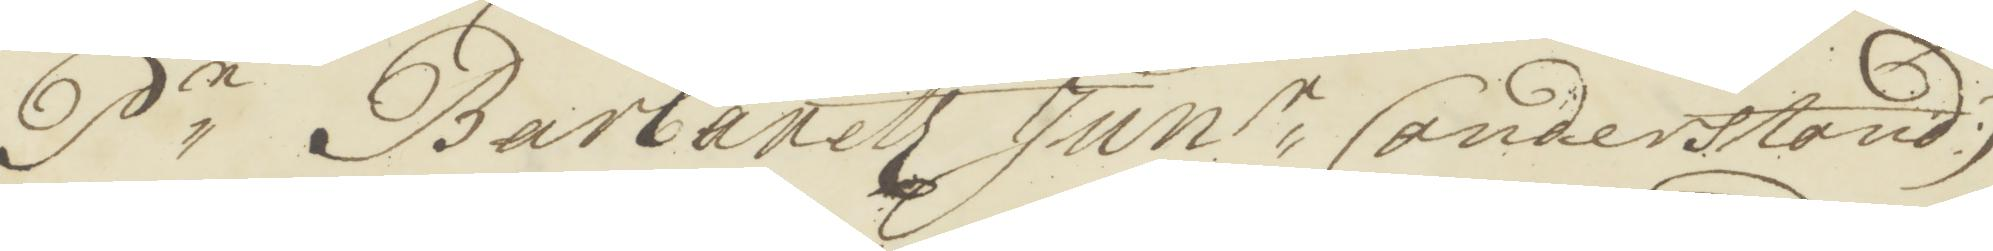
P„r Barbareth Jun„r Jun„t (onderstond:)
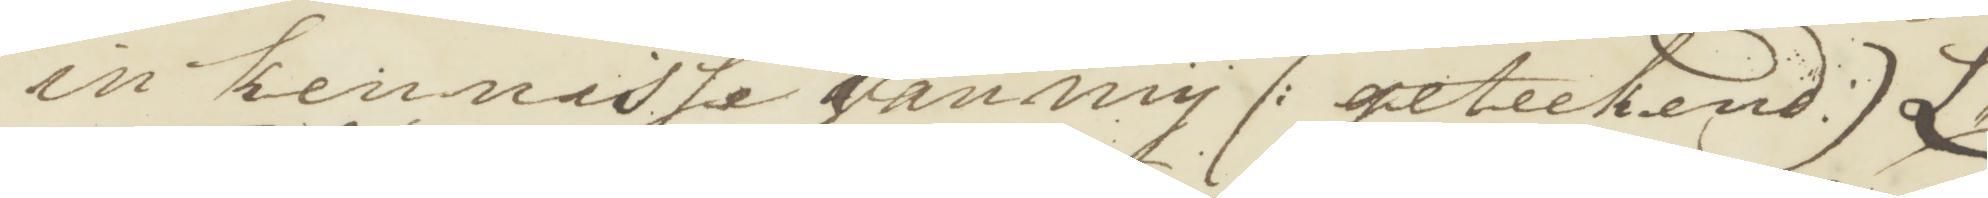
in kennisse van mij (:geteekend:) L„s
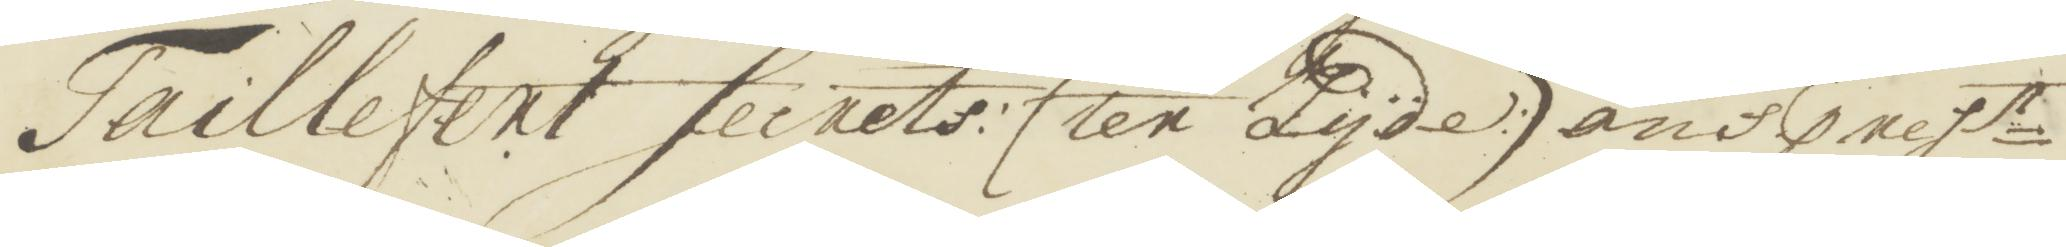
Taillefert secrets: (ter zijde:) ons pres=t
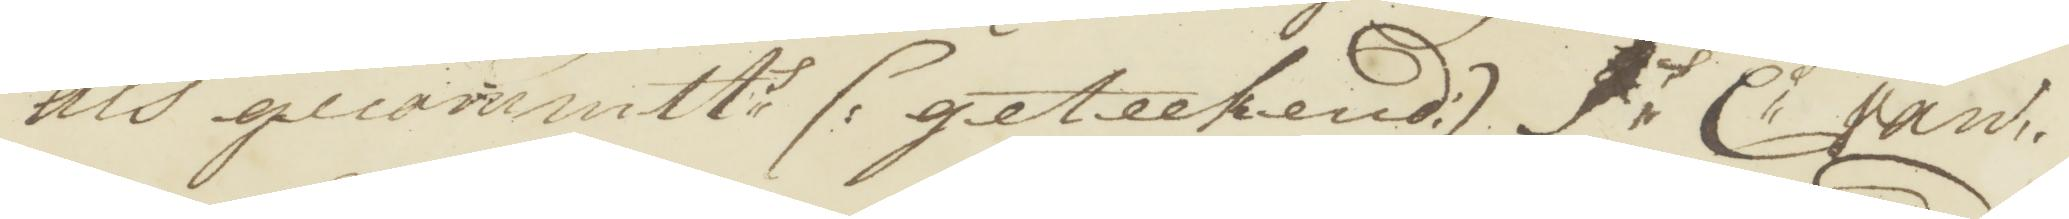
als gecommtt„s (:geteekend:): I„s C„s van„
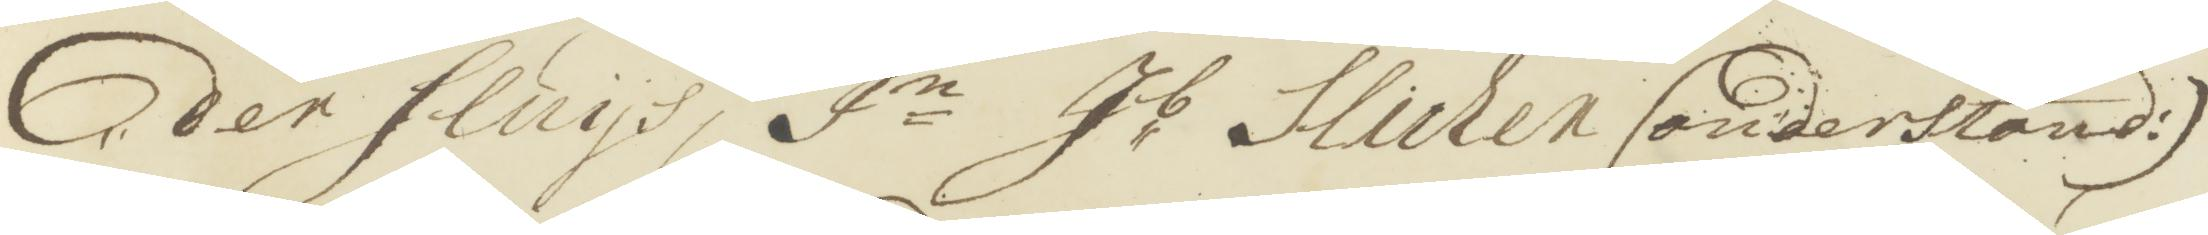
der Sluijs, I=n J„b Slicher (onderstond:)
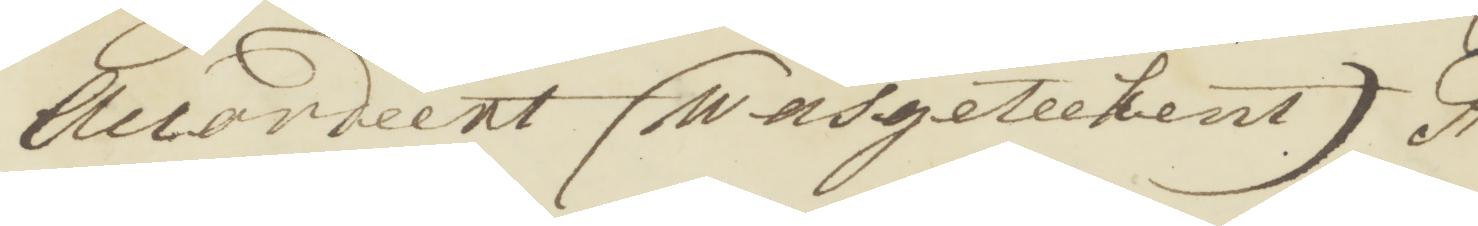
Accordeert (was geteekent) F„k Brouwer
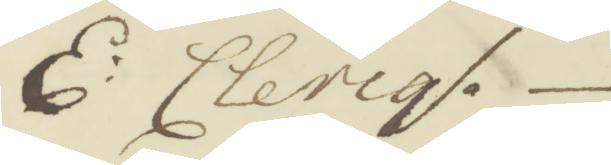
E: Clercq. —
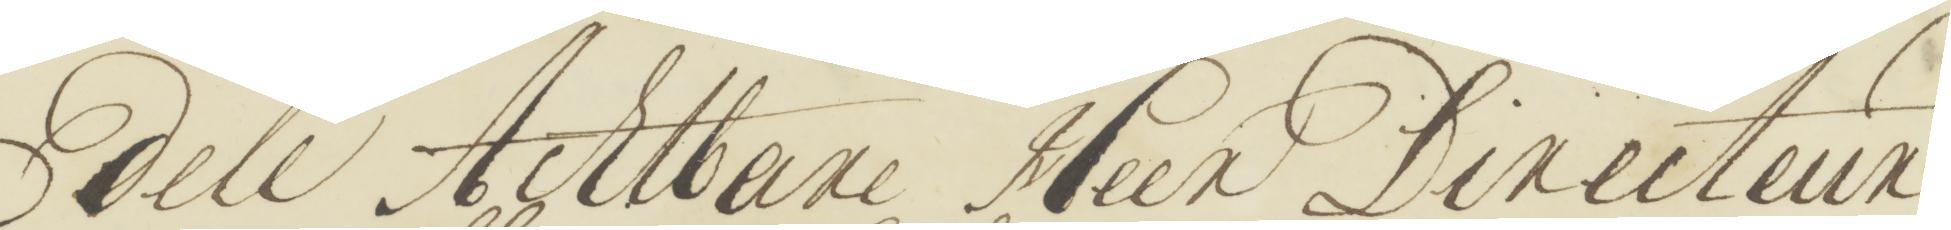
Edele Achtbare Heer Directeur
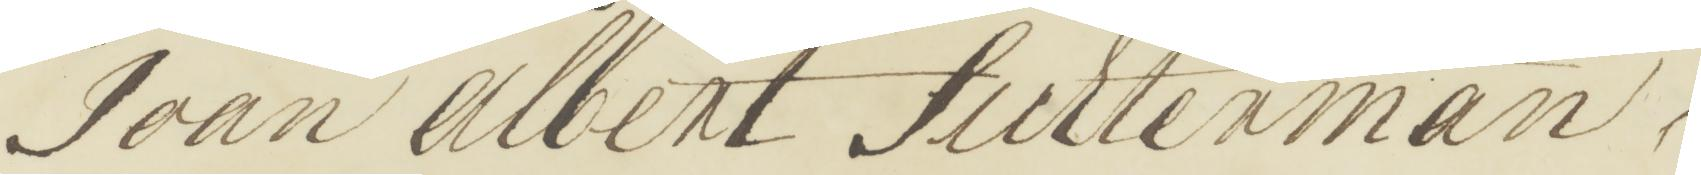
Ioan albert Sichterman,
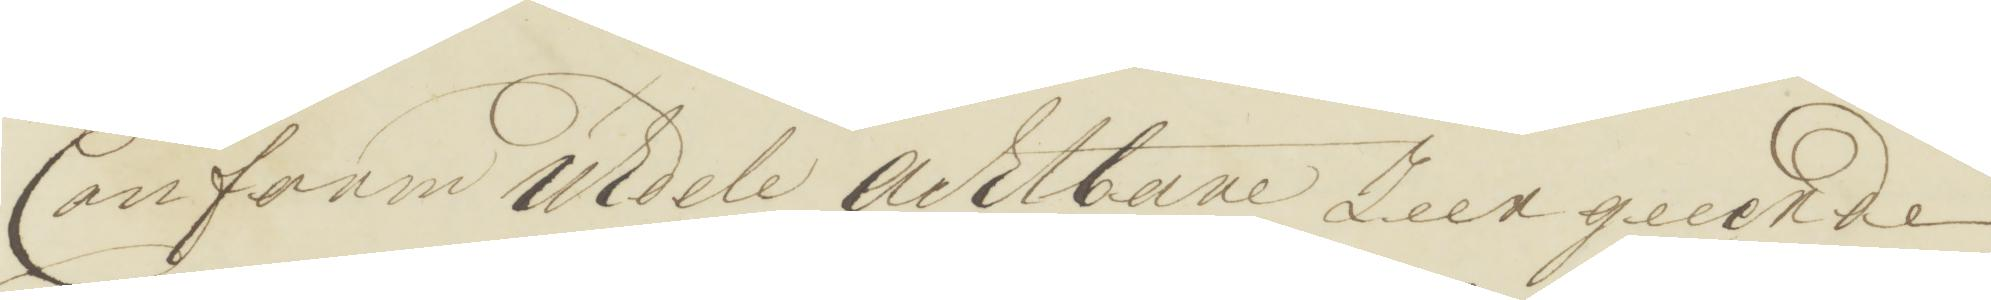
Conform uEdele achtbare zeer geeerde
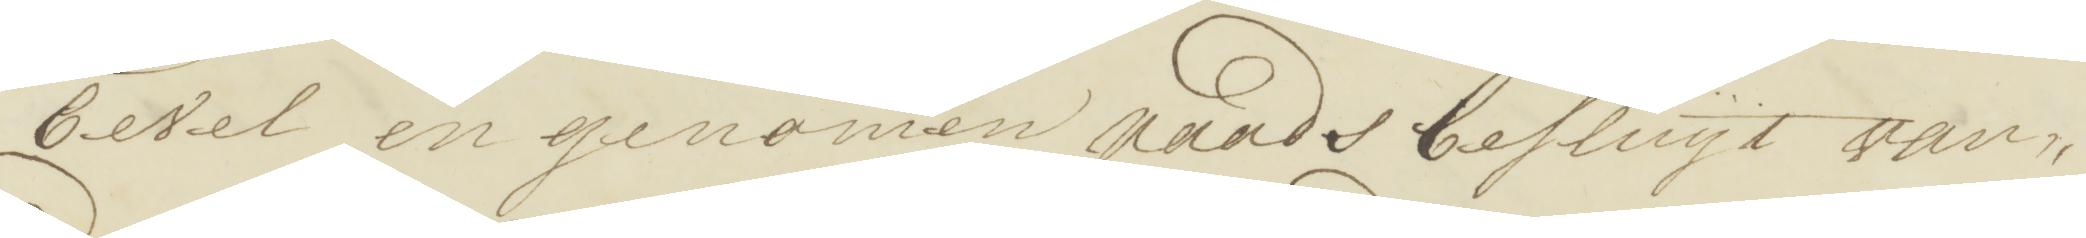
bevel en genomen raads besluijt van„
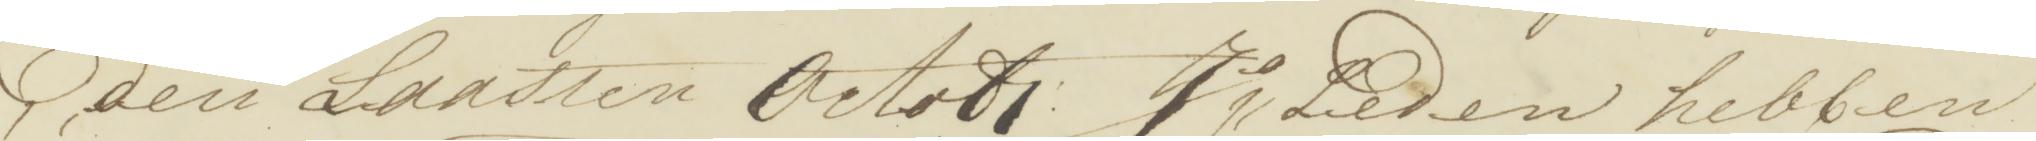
den Laasten Octobr: J„o Leden hebben
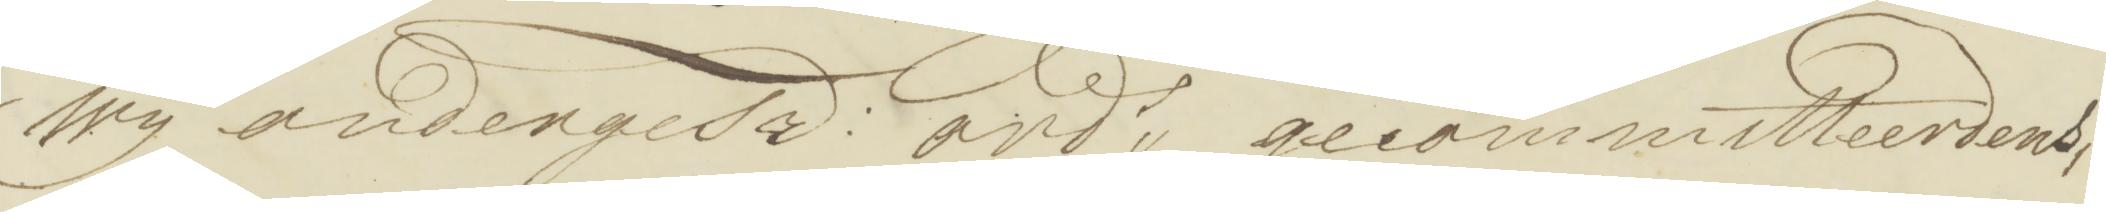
wij ondergesz: ord„s gecommitteerdens,
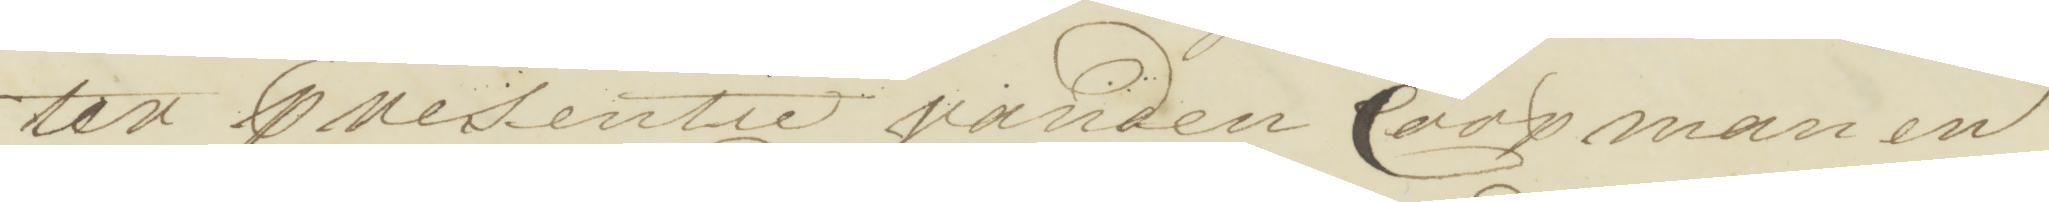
ter presentie vanden Coopman en
